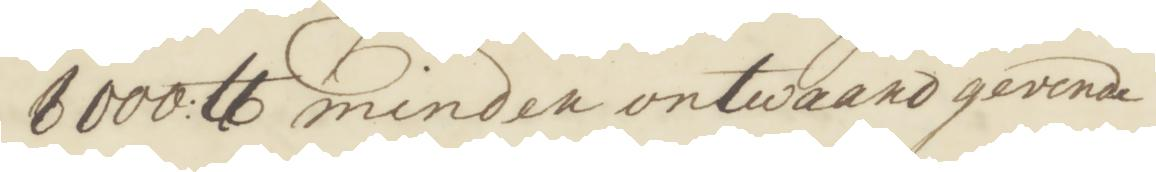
8000: lb minder ontwaard gevende
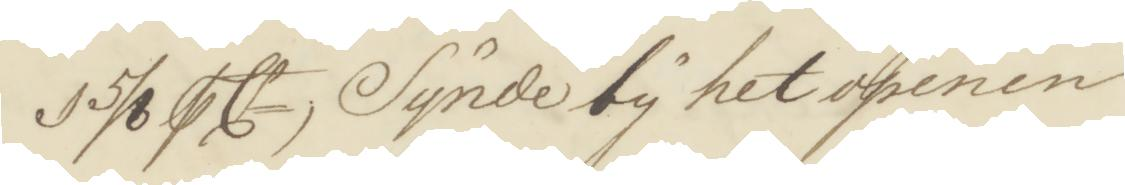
1 5/8 pC=t, sijnde bij het openen
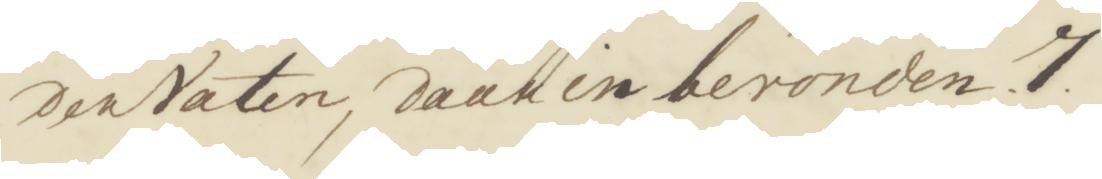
der vaten, daar in bevonden 7.
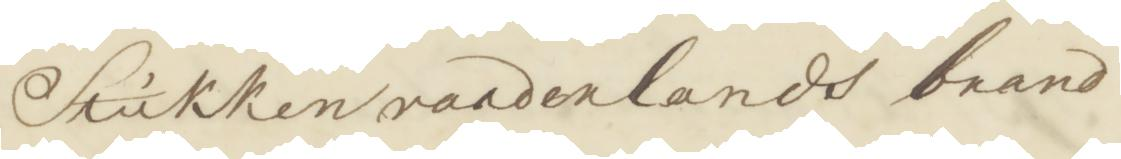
stukken vaaderlands brand
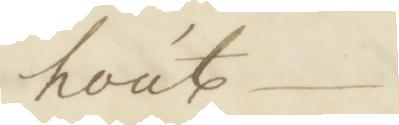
hout —
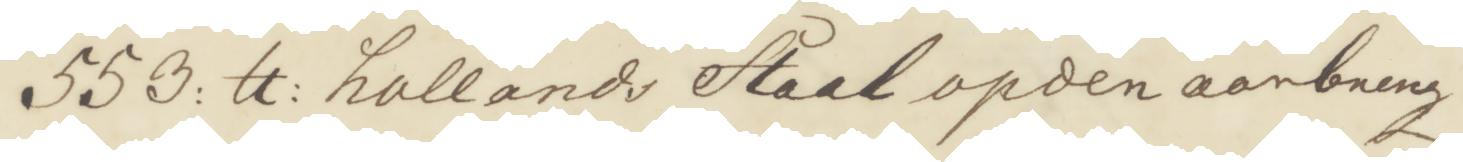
553: lb: hollands staal op den aanbreng
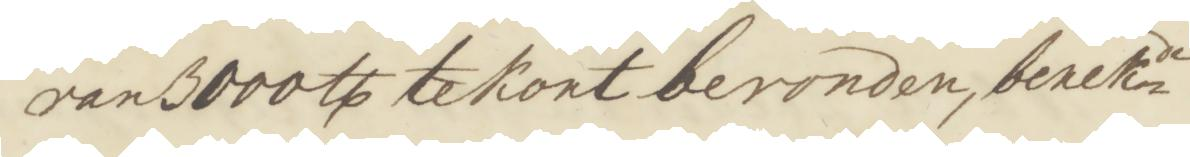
van 3000 lb tekort bevonden, berek=de
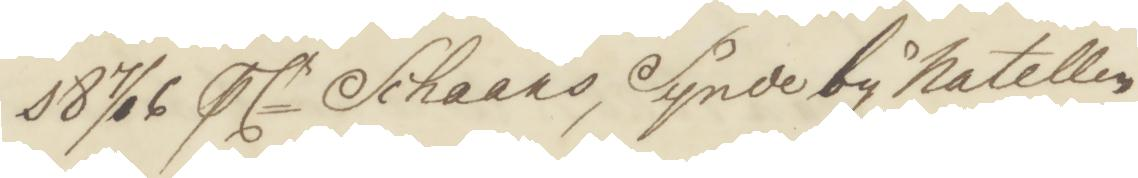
18 7/16 pC=t schaars, sijnde bij natellen
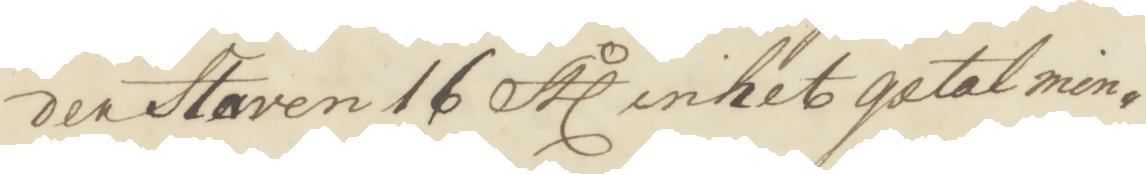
der staven 16 stx in het getal min„
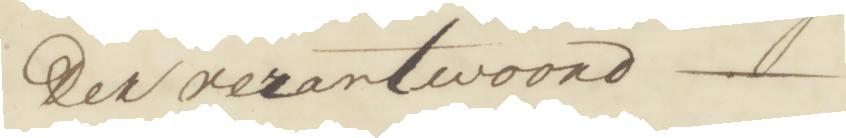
der verantwoord —
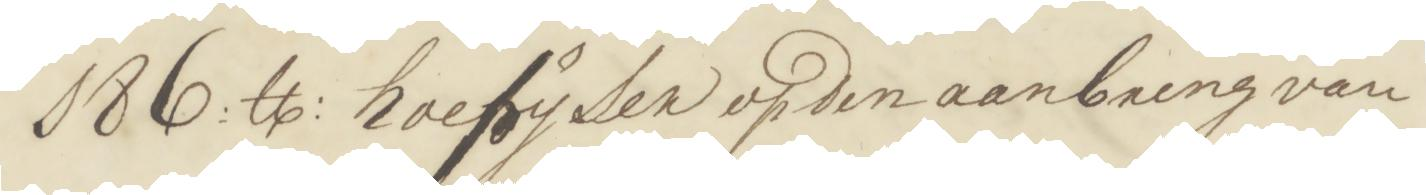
186: lb: hoepijser op den aanbreng van
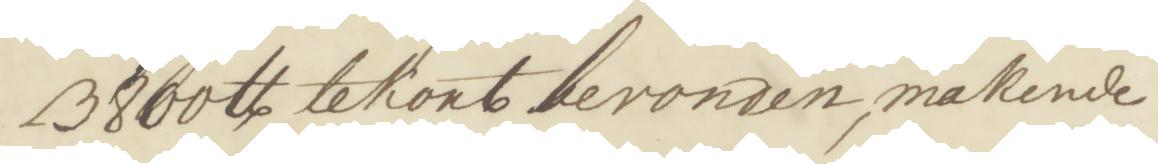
3800 lb tekort bevonden, makende
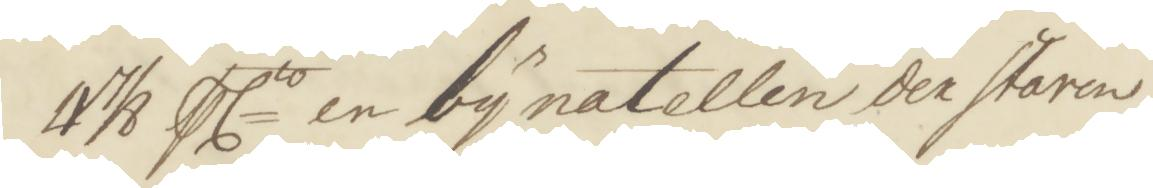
4 7/8 pC=to en bij natellen der staven
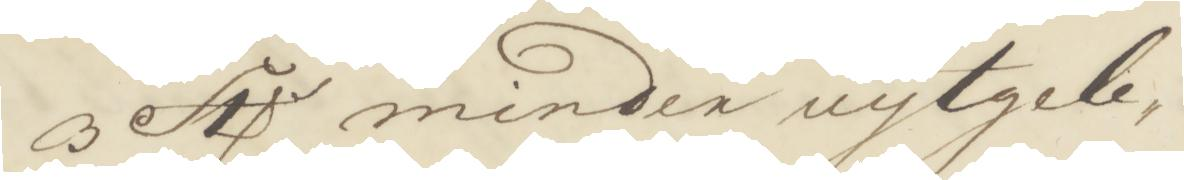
3 stx minder uijtgele„
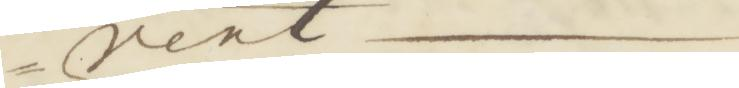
„vert —
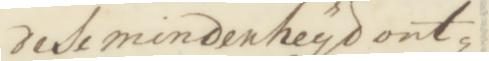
dese minderheijd ont„
